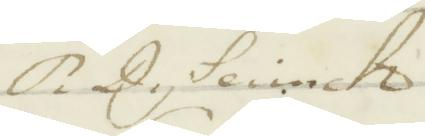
P: D, Schinck
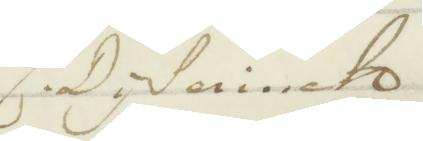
C.D Dijserinck
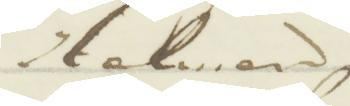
Helmer
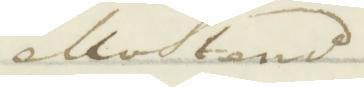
Mostend
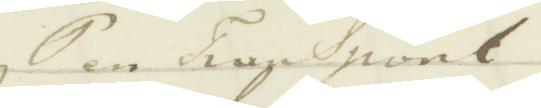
Per Trensport
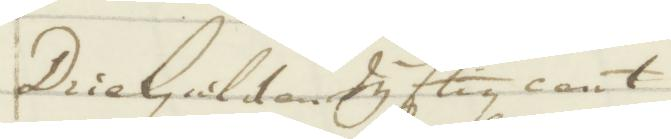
Drie Gulden Vijftig cent
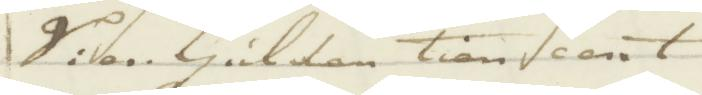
Viien Gulden tien cent
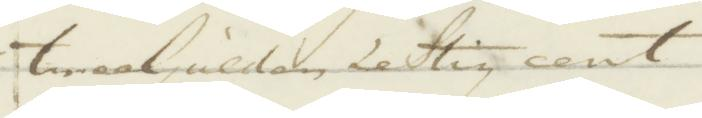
twee Gulden zestig cent
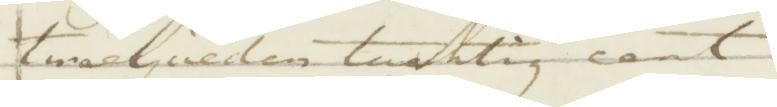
twee Gulden tachtig cent
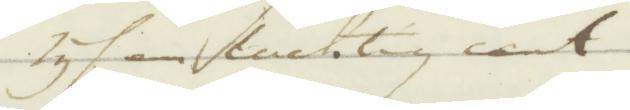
Vijf en tachtig cent
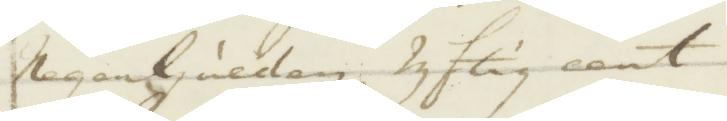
Negen Gulden Vyftig cent
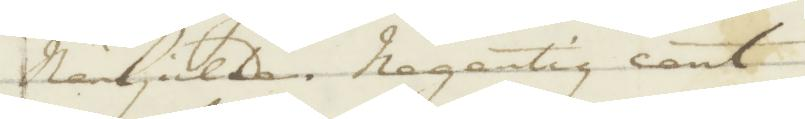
Vier Gulden negentig cents
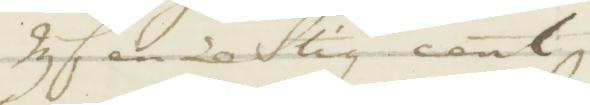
Vijf en zestig cents
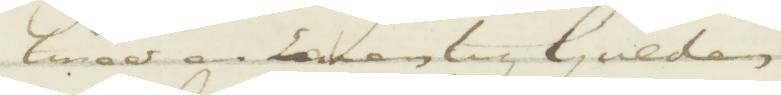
twee en Zeventig Gulden
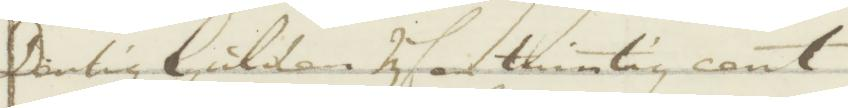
Dertig Gulden Vyf en twintig cent
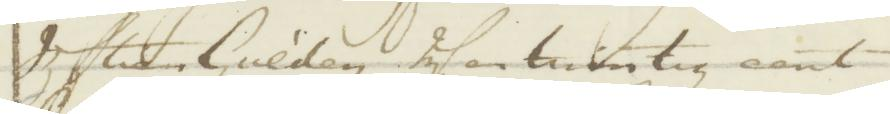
Vyftien Gulden vyfentwintig cent
